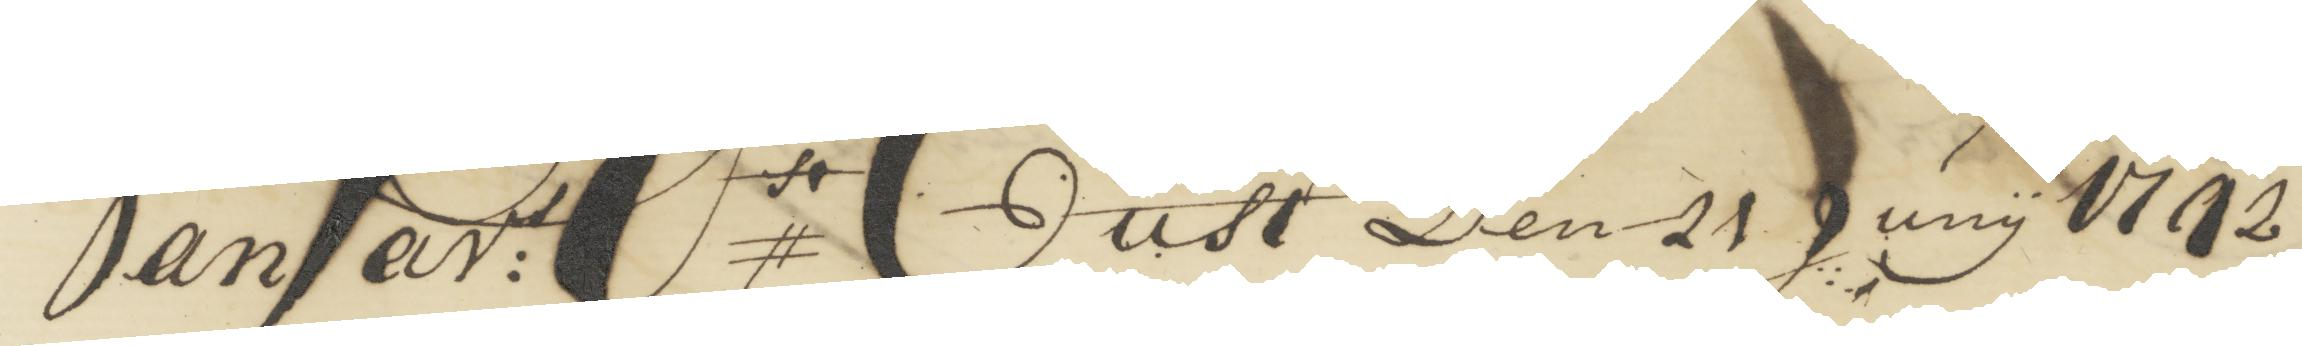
Van Jav:s O#st Cust Den 21 Junij 1742
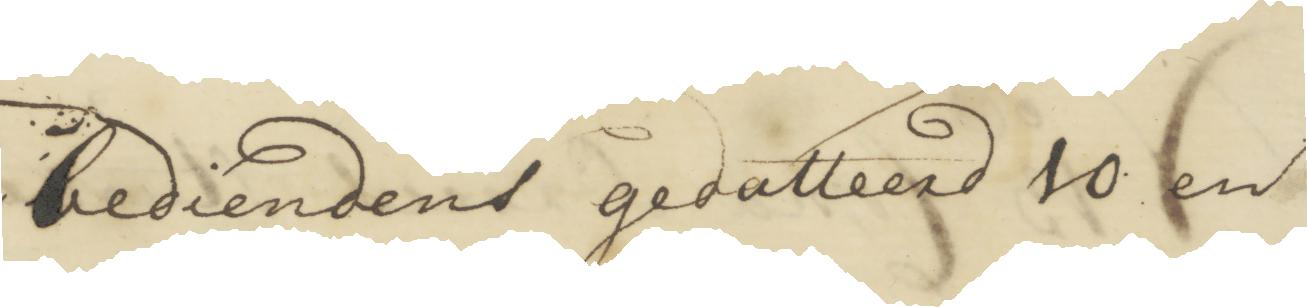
bediendens gedatteerd 10 en
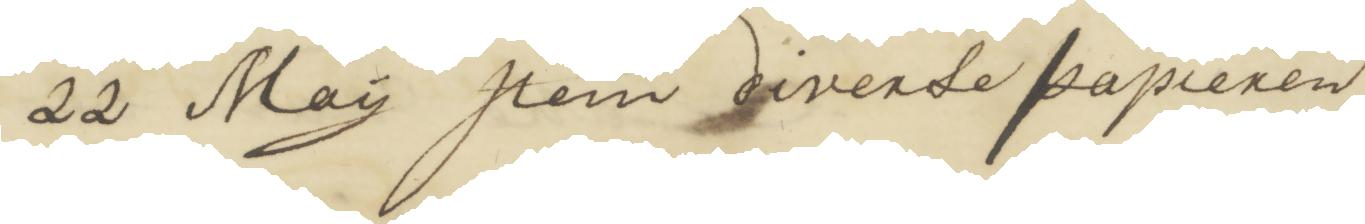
22 Maij jtem diverse papieren
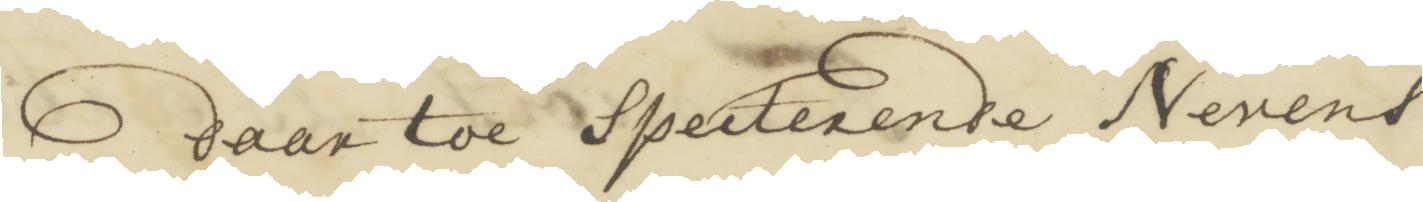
daar toe Specterende Nevens
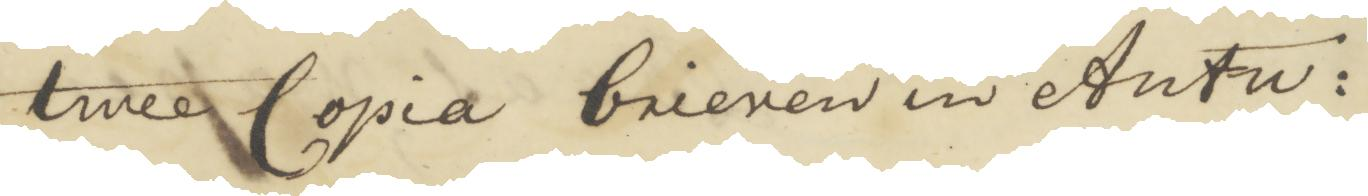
twee Copia brieven in Antw:
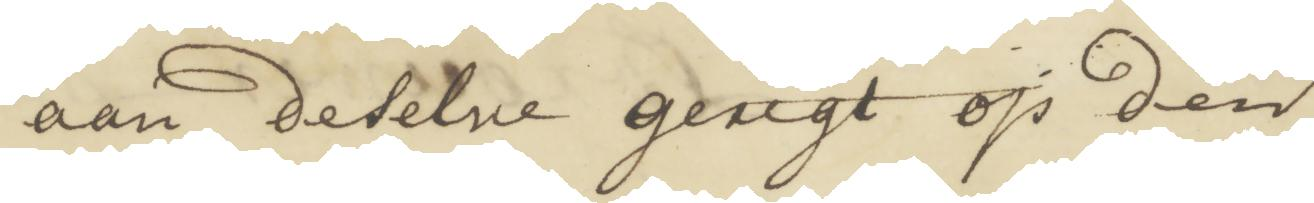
aan deselve gerigt op den
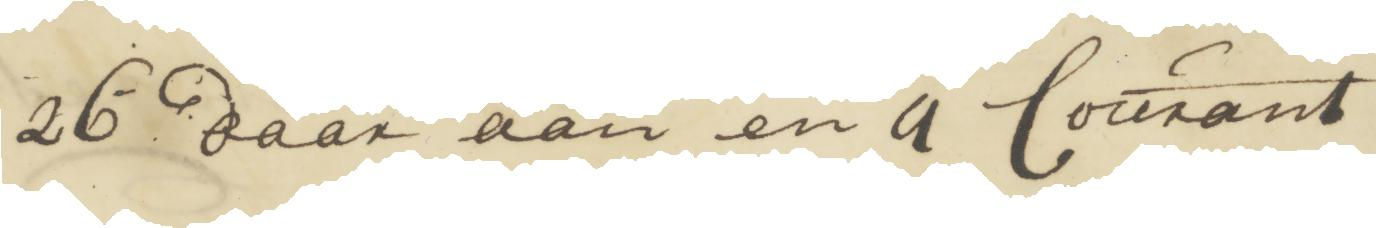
26 daar aan en 4 Courant
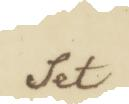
set
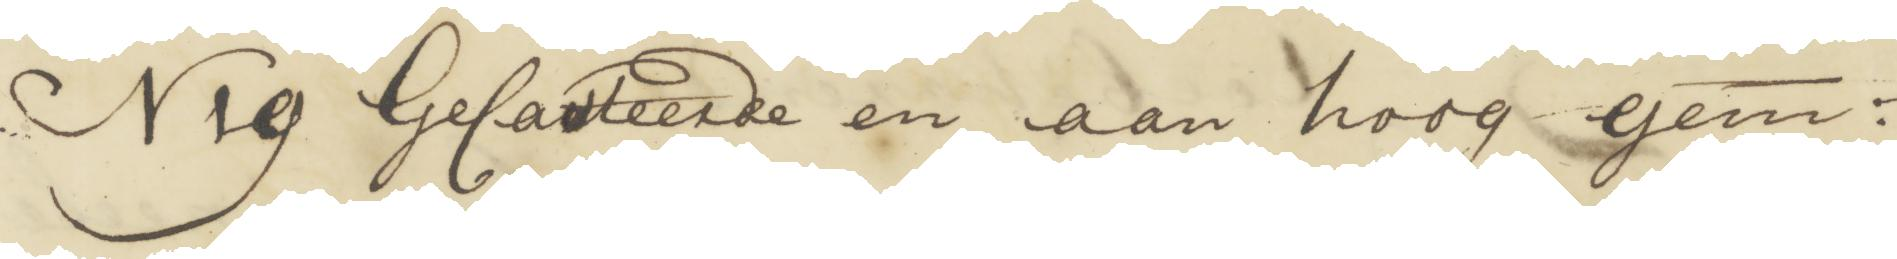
N19 Gecasteerde en aan hoog gem:
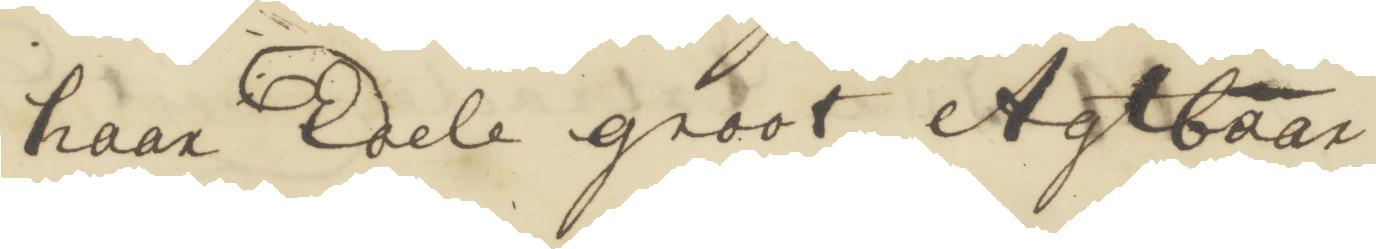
haar Edele groot Agtbaar
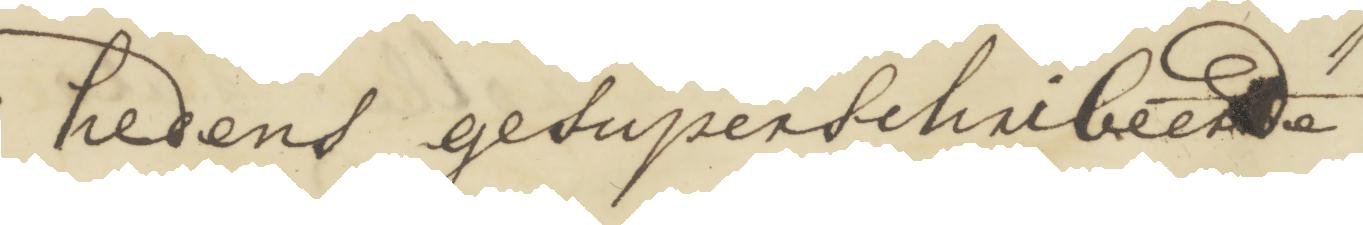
hedens gesuperschribeerde
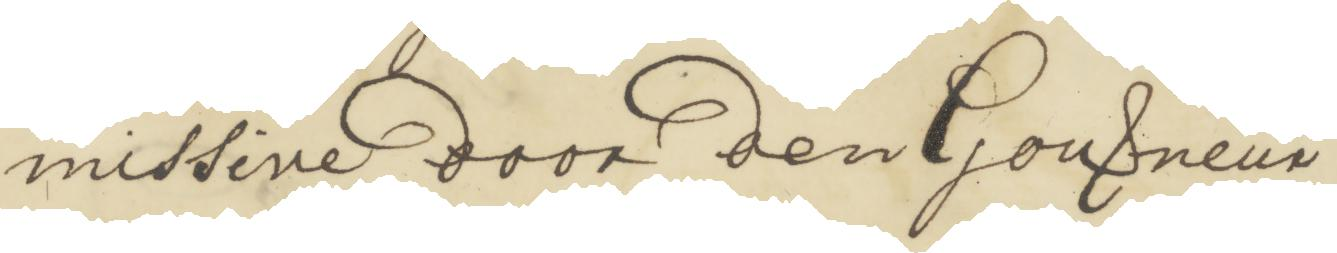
missive door den Gouverneur
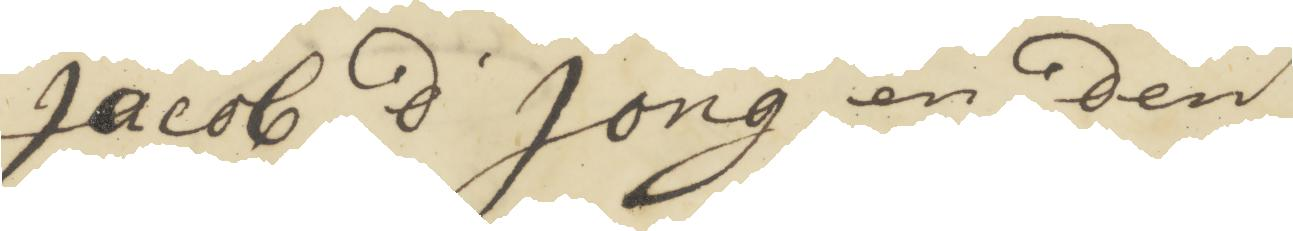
Jacob d’ Jong en den
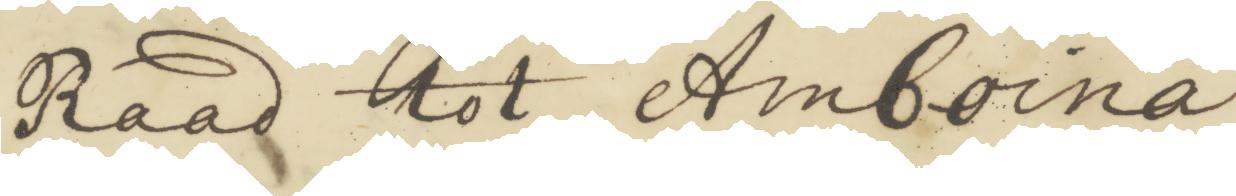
Raad tot Amboina
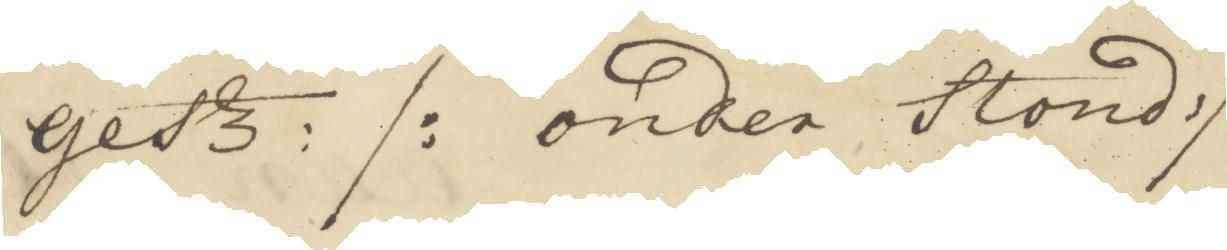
gesz: /:onder stond:/
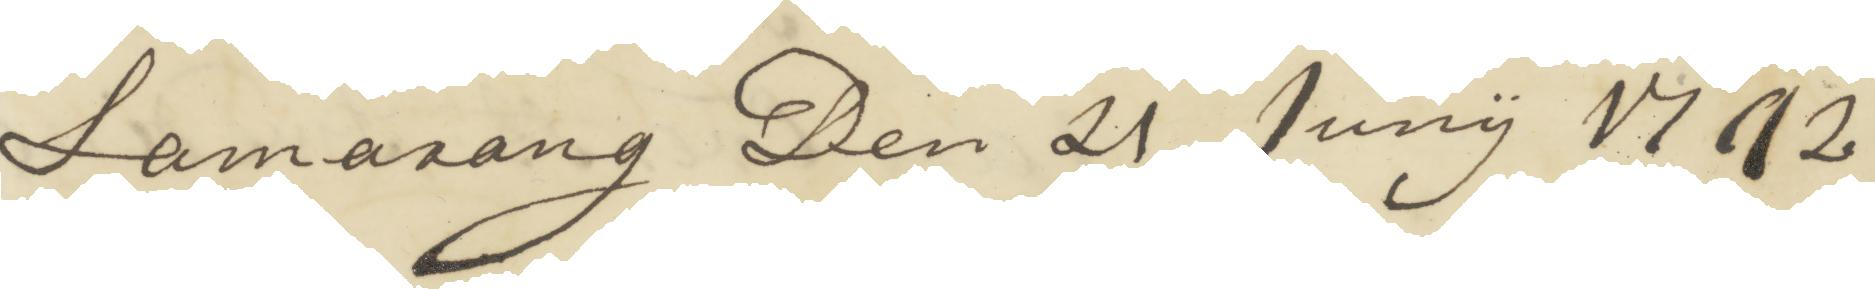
Samarang Den 21 Junij 1742
